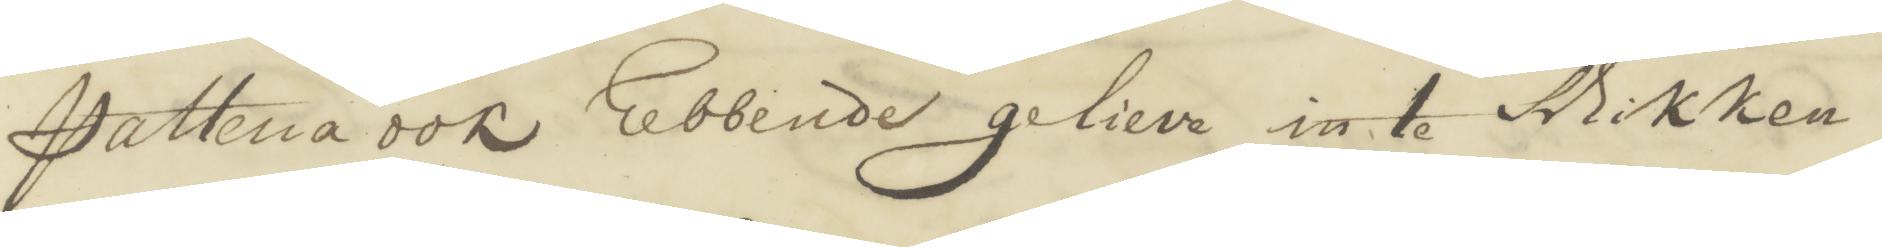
Pattena ook hebbende gelieve in te schikken
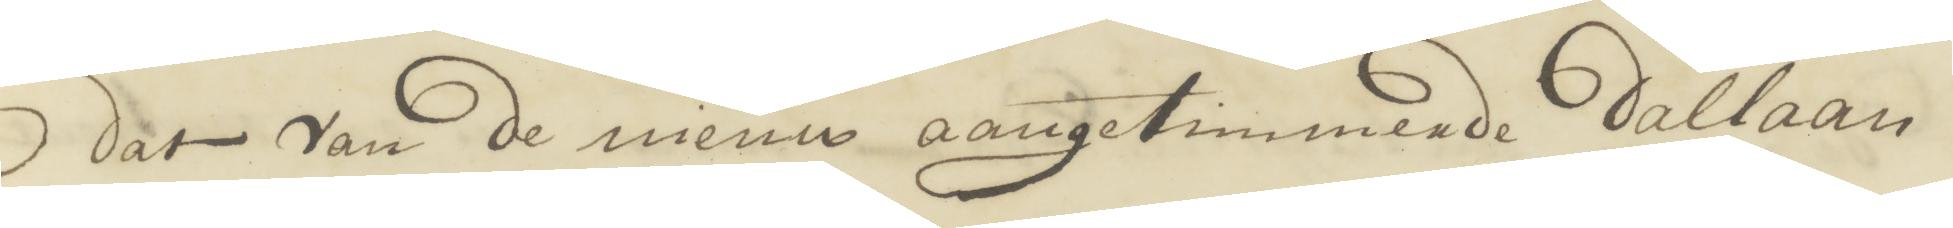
dat van de nieuw aangetimmerde dallaan
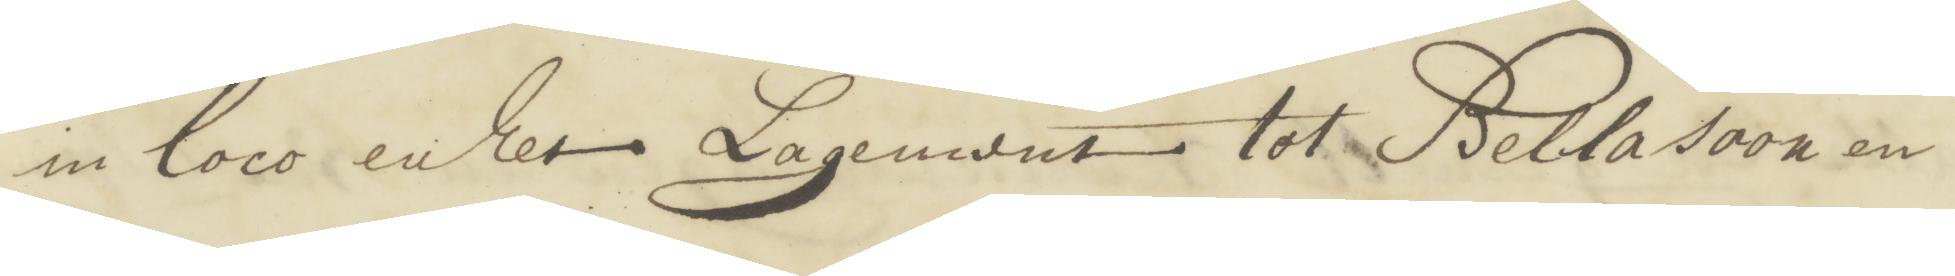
in loco en het Logement tot Bellasoor en
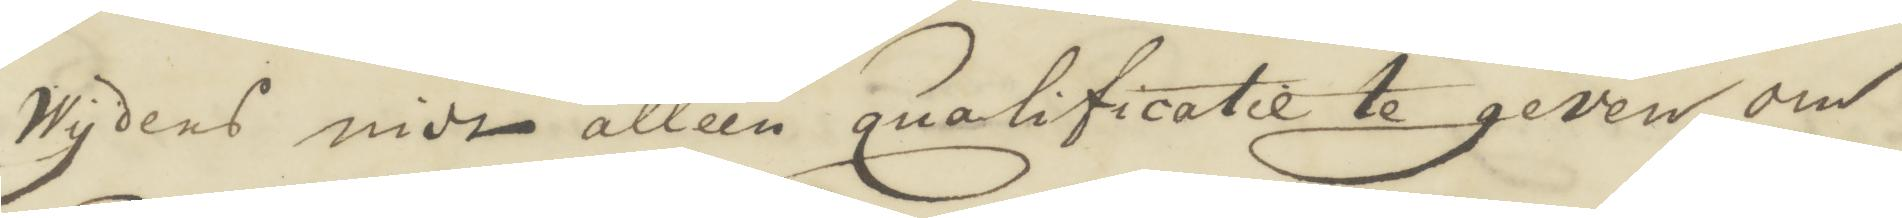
wijders niet alleen qualificatie te geven om
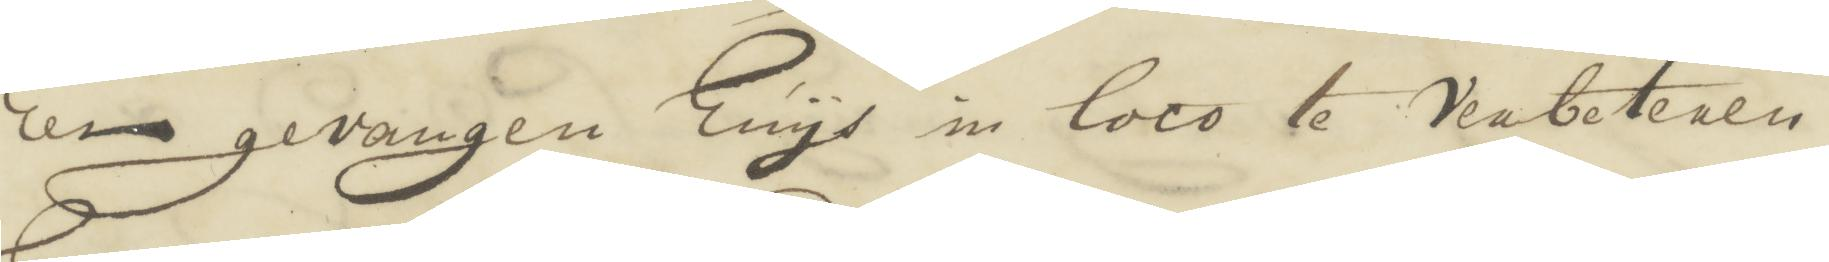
een gevangen huijs in loco te verbeteren
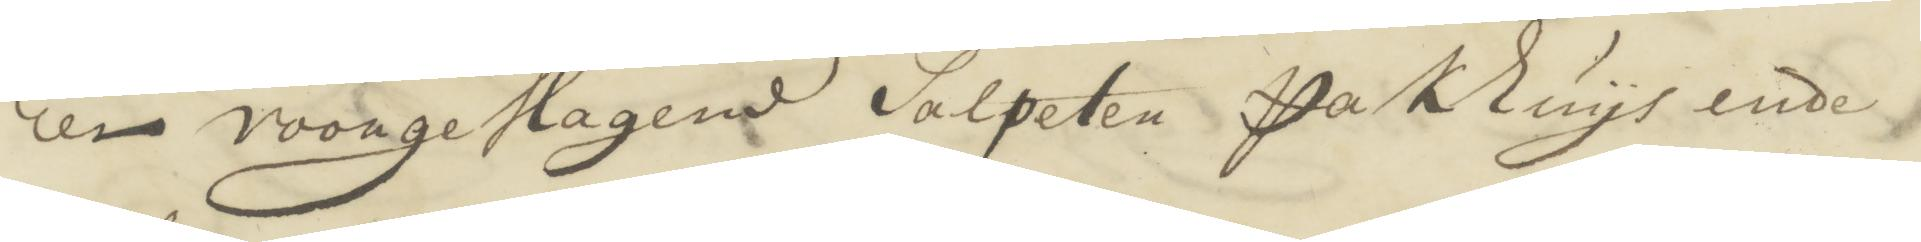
het voorgeslagene salpeter pakhuijs ende
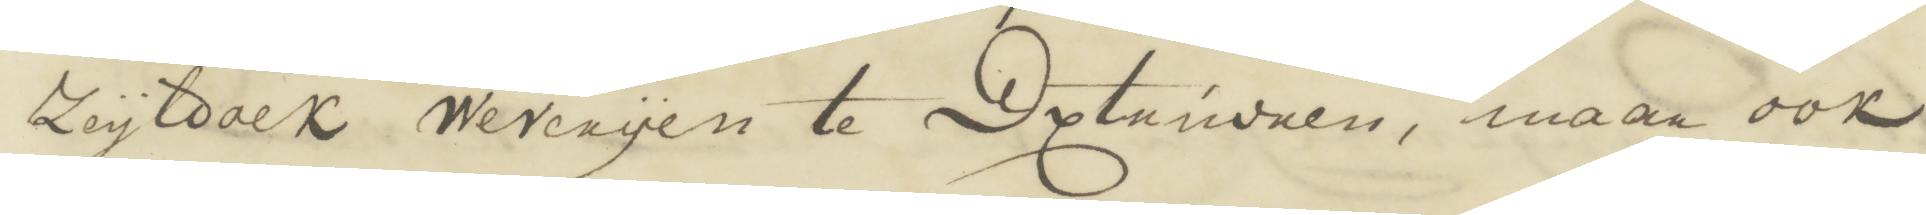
zeijldoek weverijen te Extrueren, maar ook
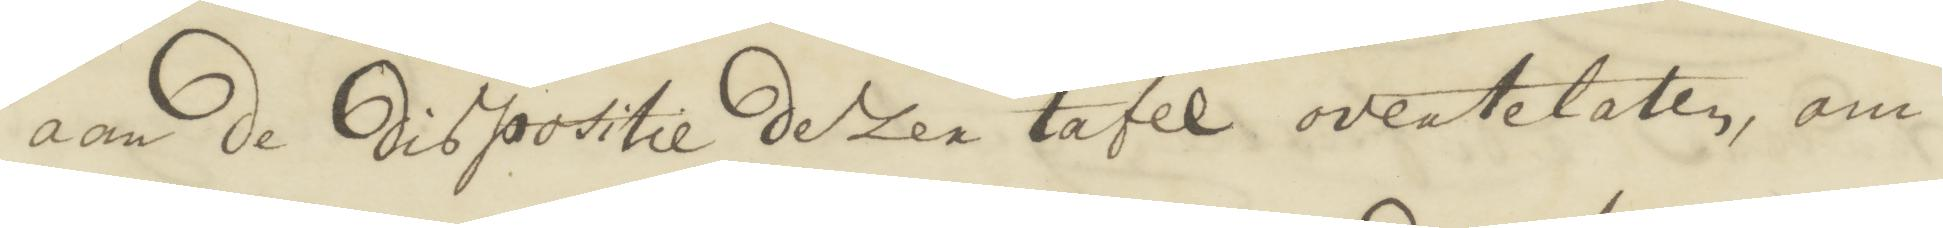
aan de dispositie dezer tafel overtelaten, om
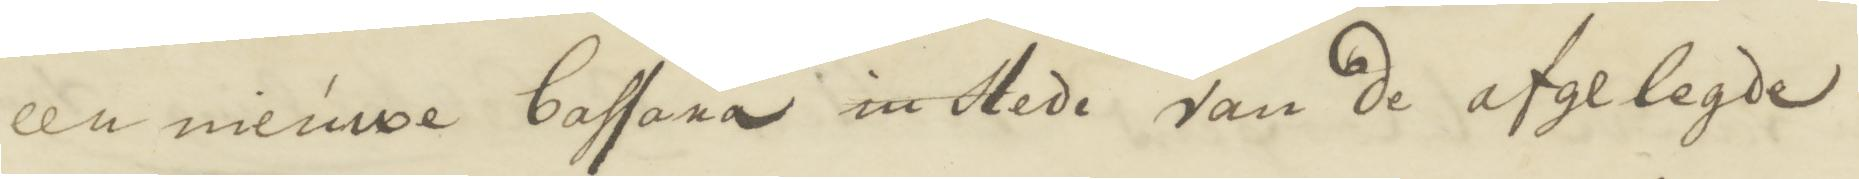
een nieuwe bassara in stede van de afgelegde
